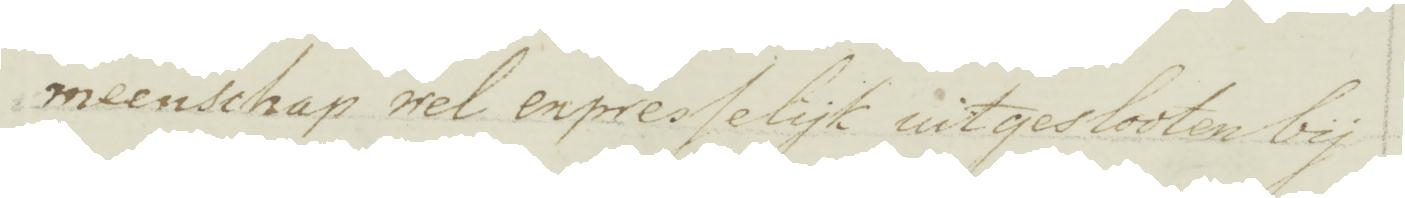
meenschap wel expresselijk uitgeslooten bij
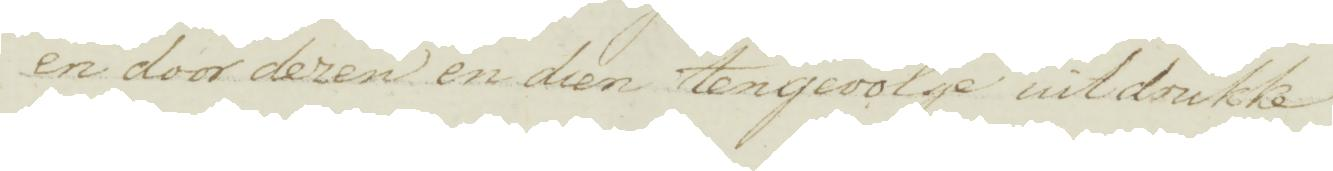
en door dezen en dien tengevolge uitdrukke
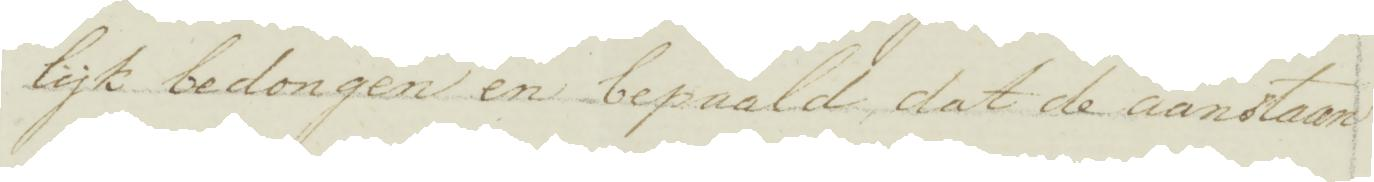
lijk bedongen en bepaald, dat de aanstaan
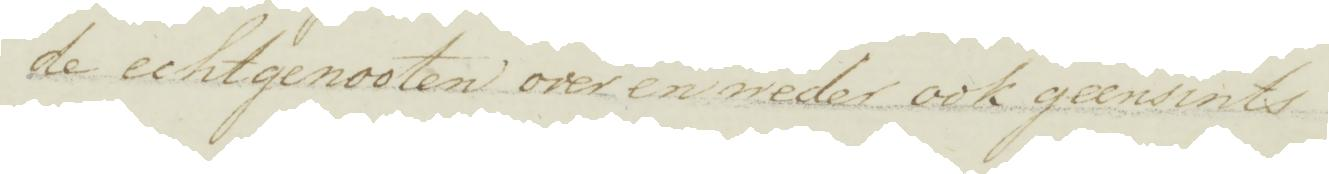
de echtgenooten over en weder ook geensints
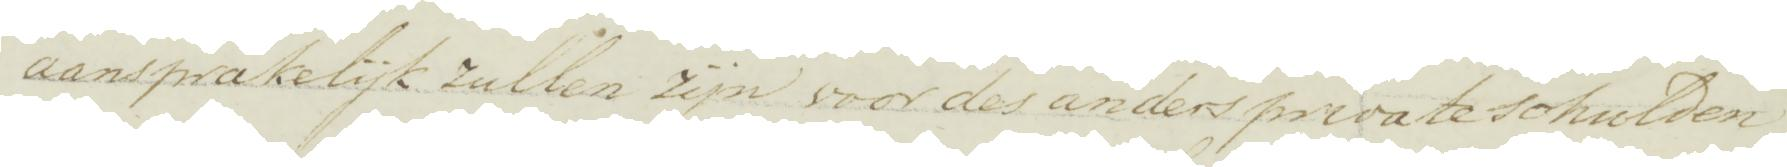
aansprakelijk zullen zijn voor des anders private schulden
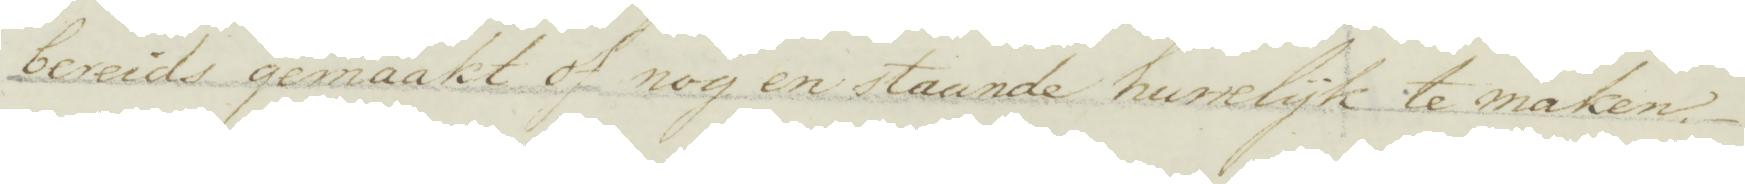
bereids gemaakt of nog en staande huwelijk te maken.
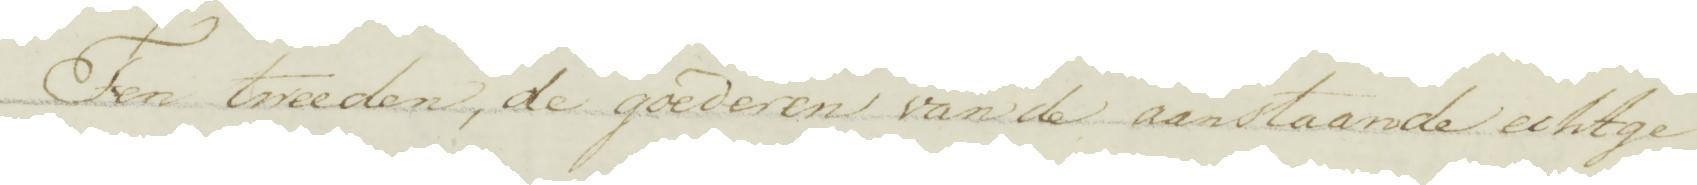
Ten tweeden, de goederen van de aanstaande echtge
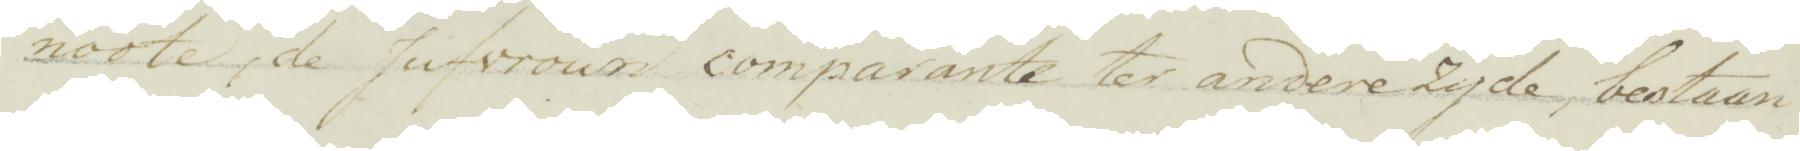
noote, de Jufvrouw comparante ter andere zijde, bestaan
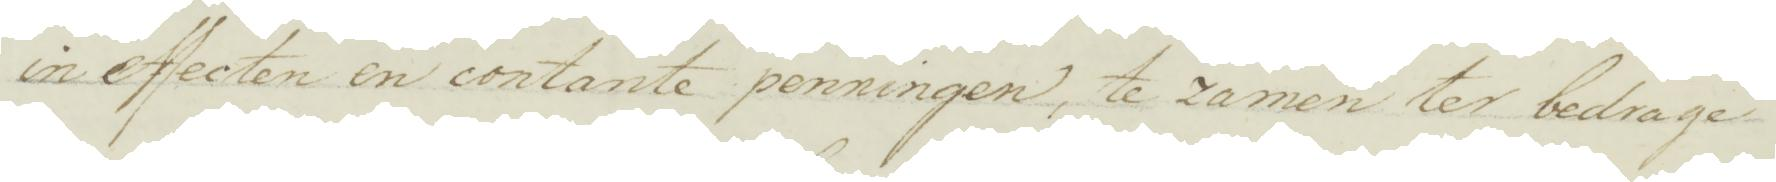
in effecten en contante penningen, te zamen ter bedrage
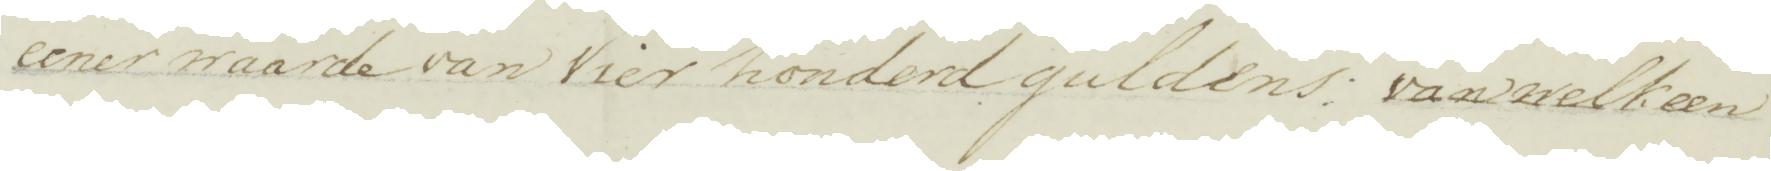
eener waarde van Vier honderd guldens: van welk een
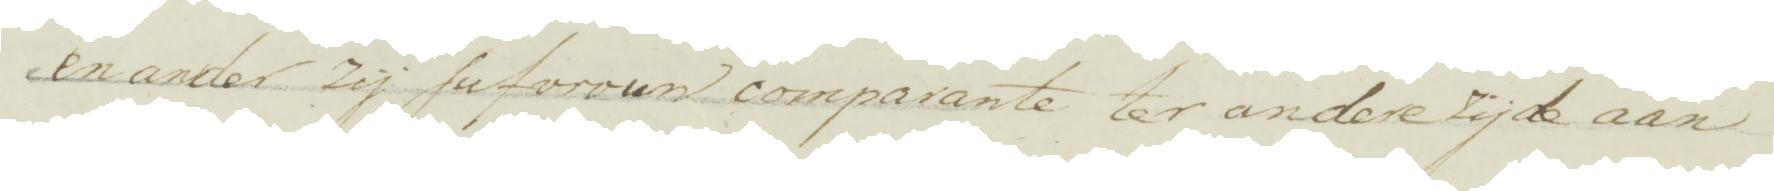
en ander zij Jufvrouw comparante ter andere zijde aan
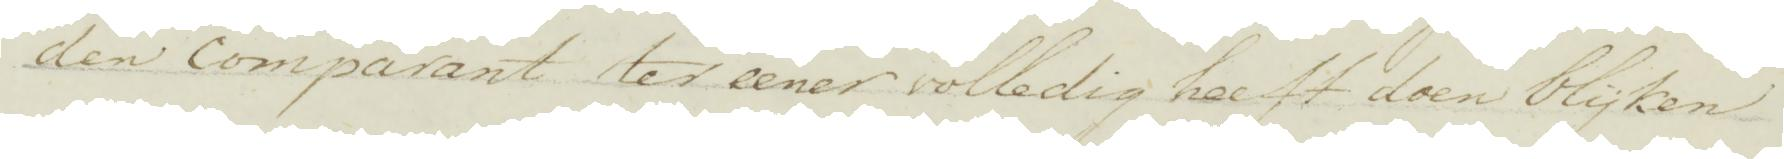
den Comparant ter eener volledig heeft doen blijken
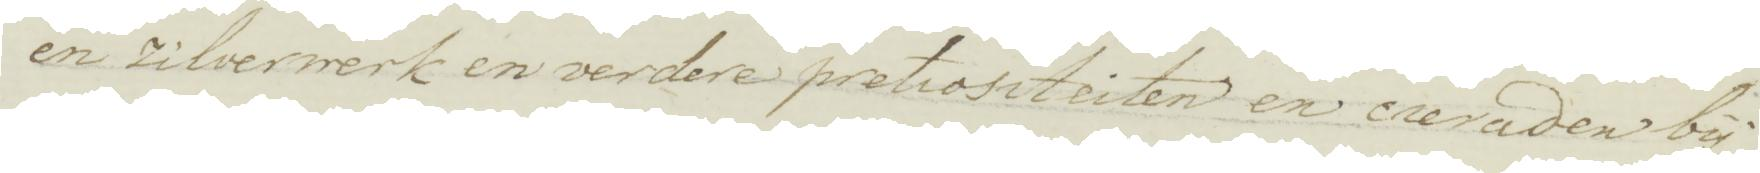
en zilverwerk en verdere pretiositeiten en cieraden bij
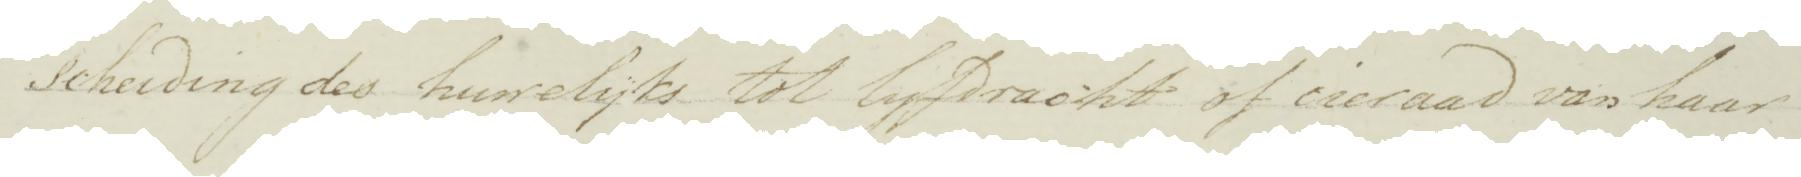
scheiding des huwelijks tot lijfdracht of cieraad van haar
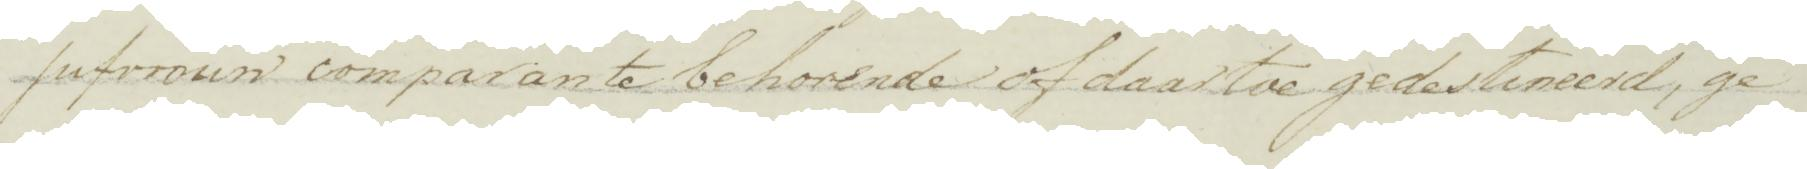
Jufvrouw comparante behorende of daar toe gedestineerd, ge
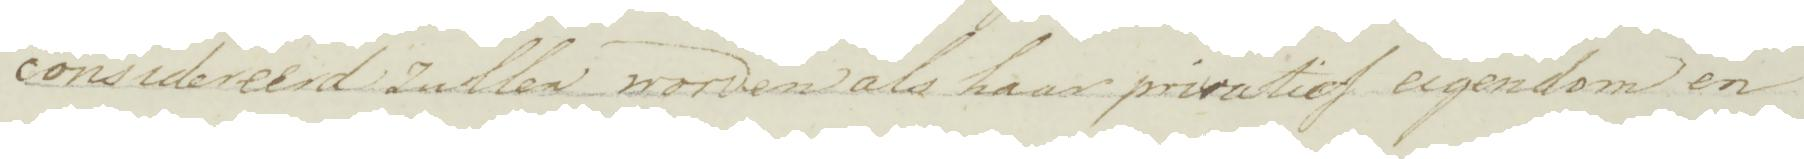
considereerd zullen worden als haar privatief eigendom en
